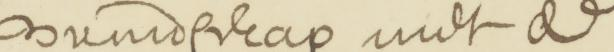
vrindschap met de
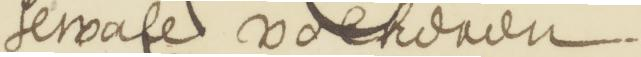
sewase volkeren
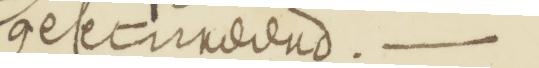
gesecureerd. —
